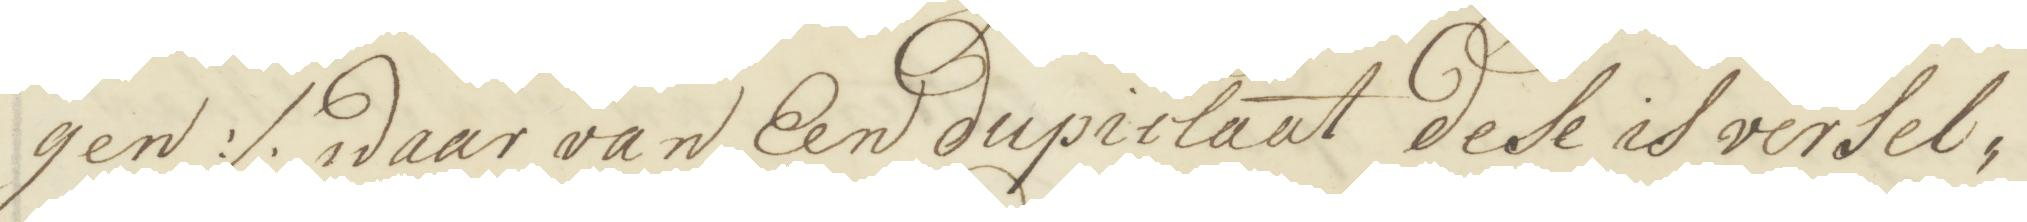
gen :/: waar van Een dupiclaat dese is versel„
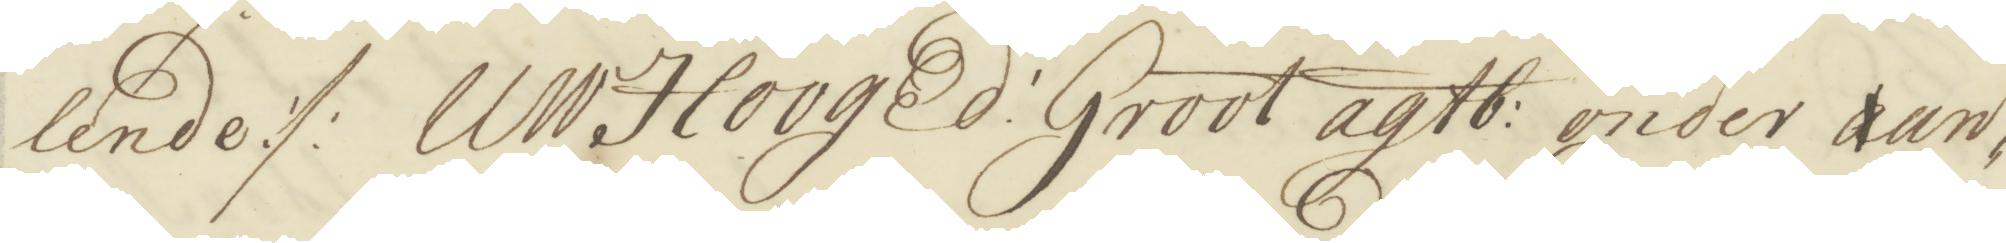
lende :/: Uw Hoog Ed: Groot agtb: onder aan
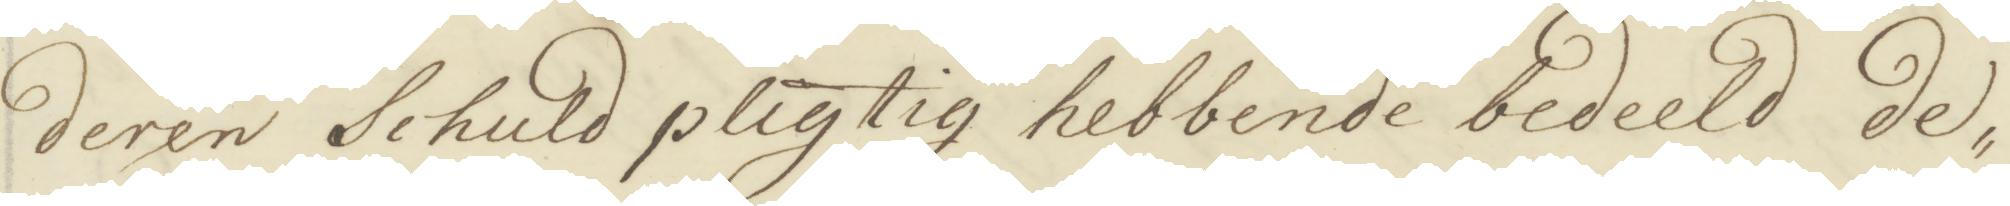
deren schuld pligtig hebbende bedeeld de„
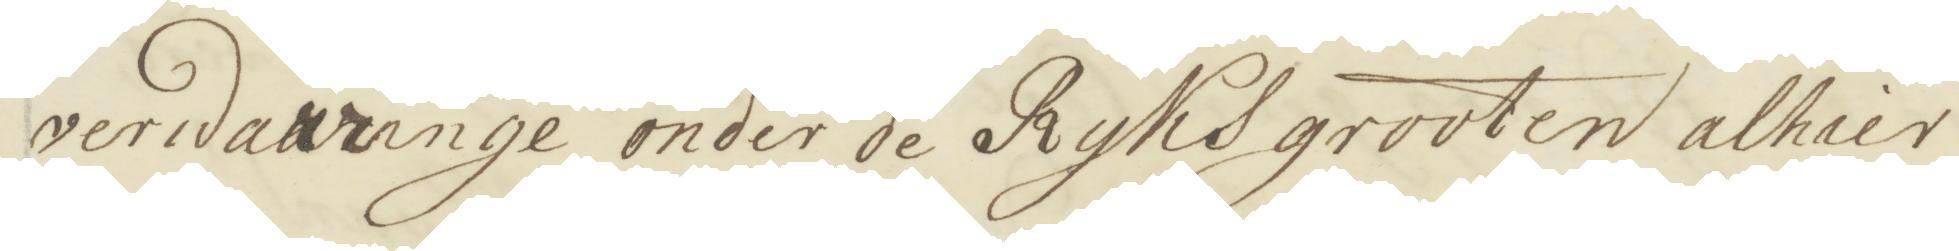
verwarringe onder de Rijksgrooten alhier
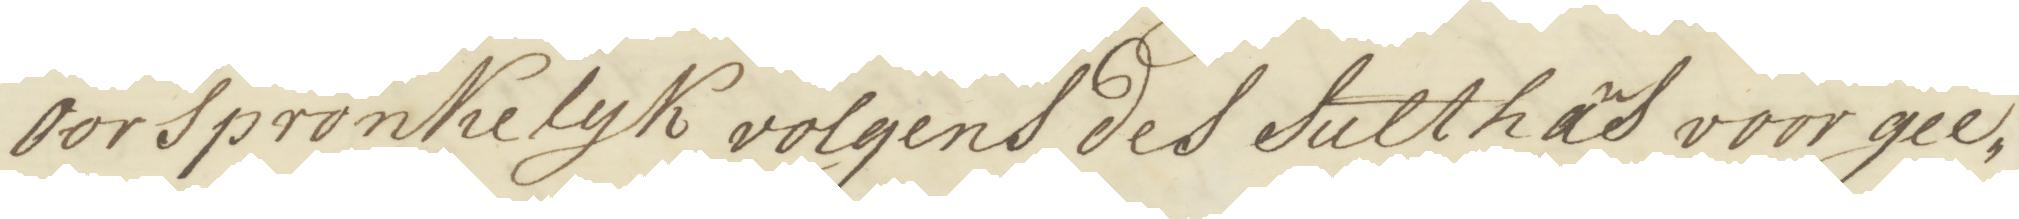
oorspronkelyk volgens des sulthans voor gee„
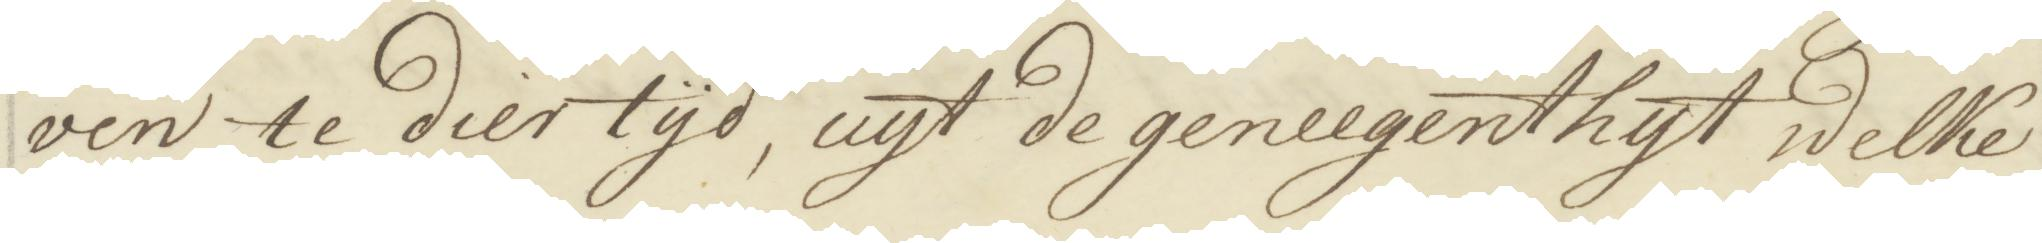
ven te dier tijd, uijt de geneegenthyt welke
